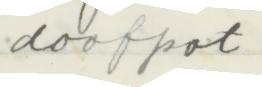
doofpot
